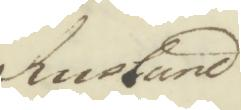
Rusland
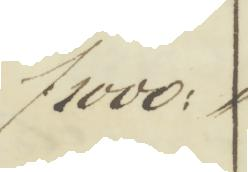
ƒ 1000: „
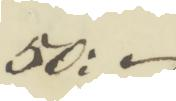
50: —
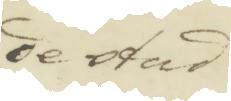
de stad
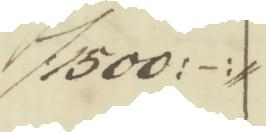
ƒ 1500: -:„
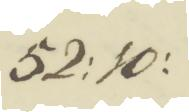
52: 10:
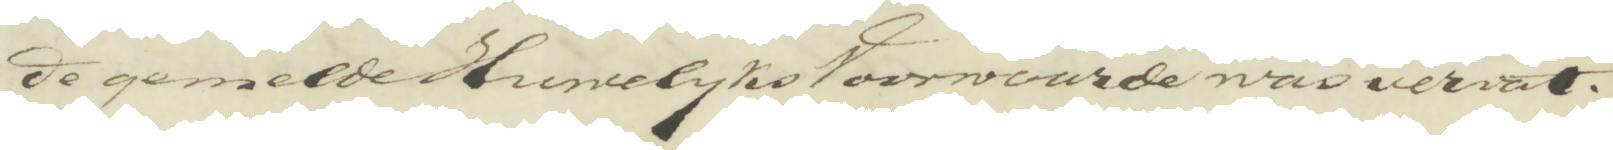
de gemelde Huwelyks voorwaarde was vervat.
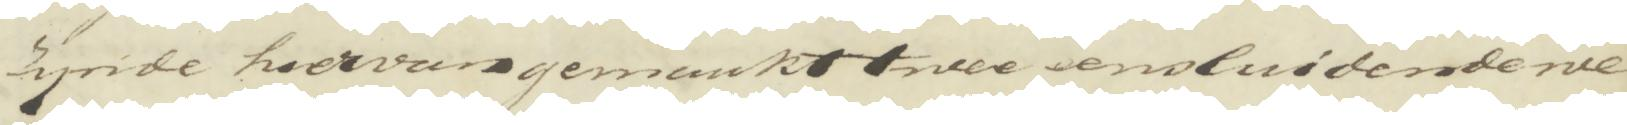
zynde hiervan gemaakt twee eensluidende we
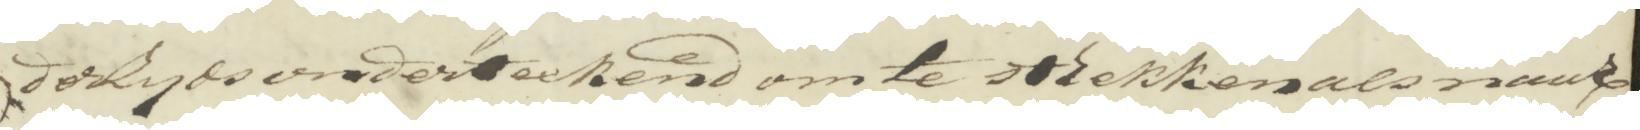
der zyds onderteekend om te strekken als als naar
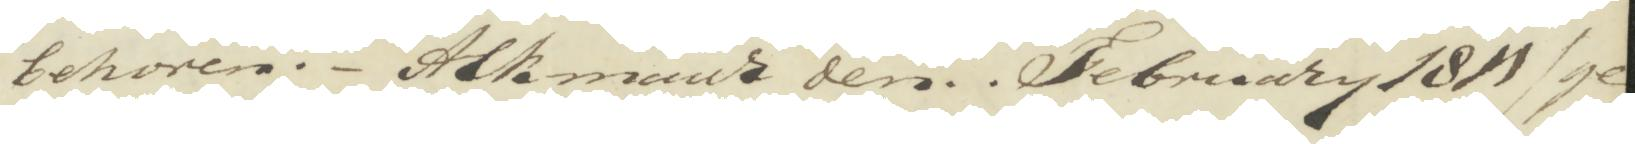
behoren. — Alkmaar den.. February 1811 /ge
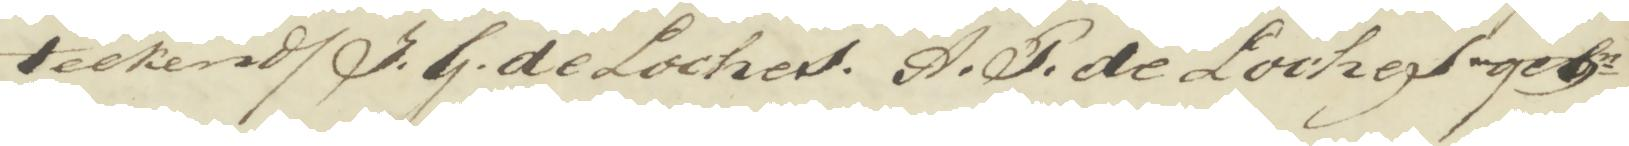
teekend J. G. de Loches. A. P. de Loches geb=n
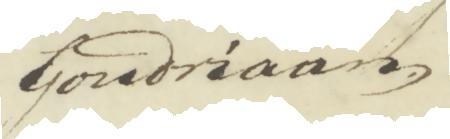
Goudriaan
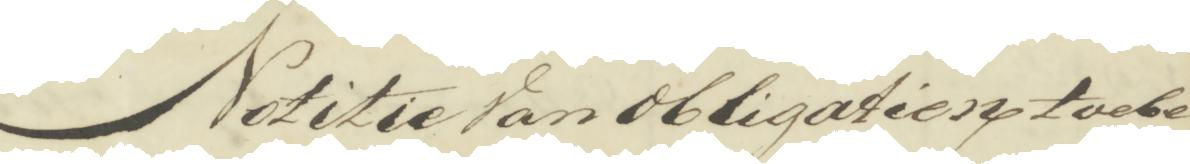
Notitie van obligatien toebe
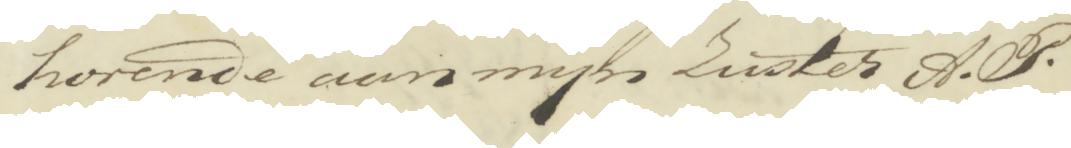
horende aan myn zuster A. P.
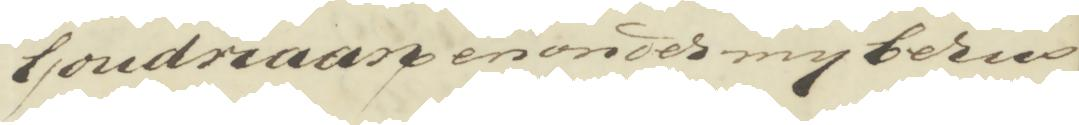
Goudriaan en onder my berus
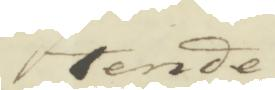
tende
